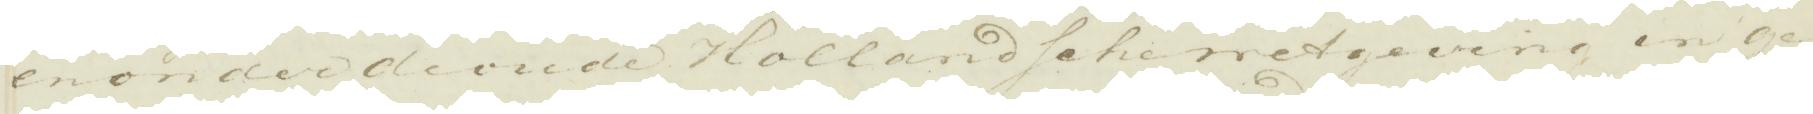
en onder de oude Hollandsche wetgeving in ge
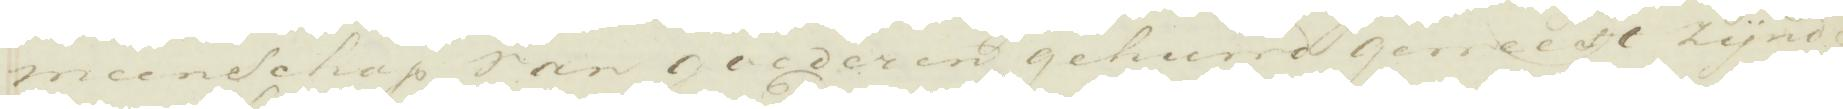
meenschap van goederen gehuwd geweest zijnde
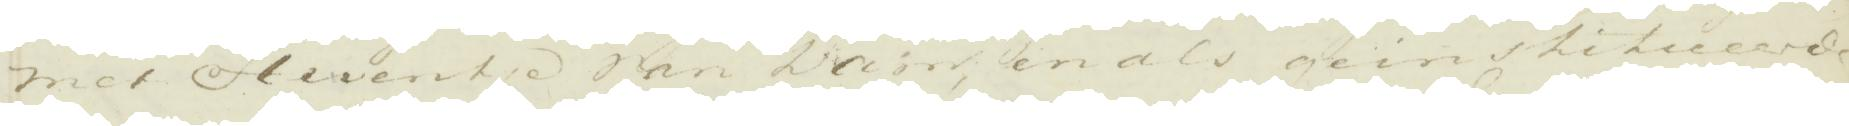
met Steventje van Dam, en als geinstitueerde
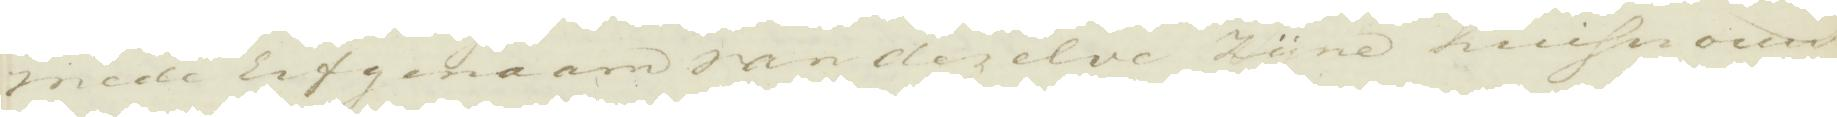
mede Erfgenaam van dezelve zijne huisvrouw
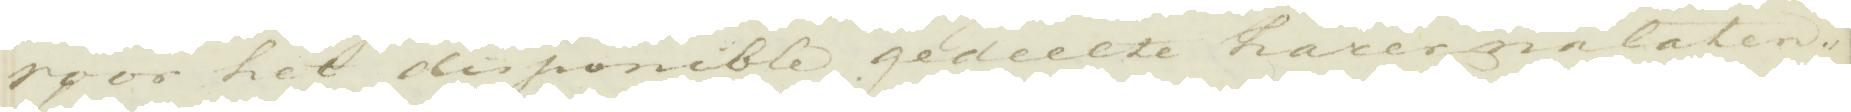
voor het disponible gedeelte harer nalaten„
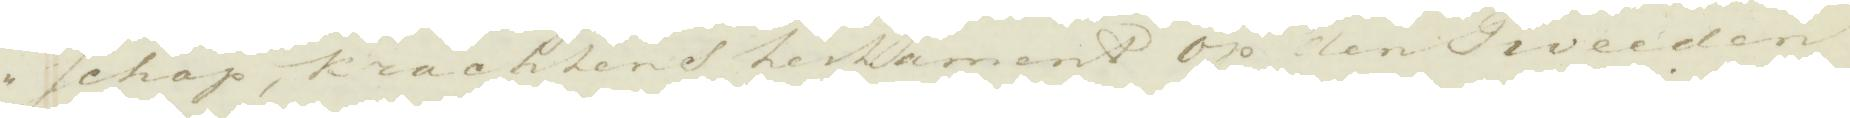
„schap, krachtens testament op den Tweeden
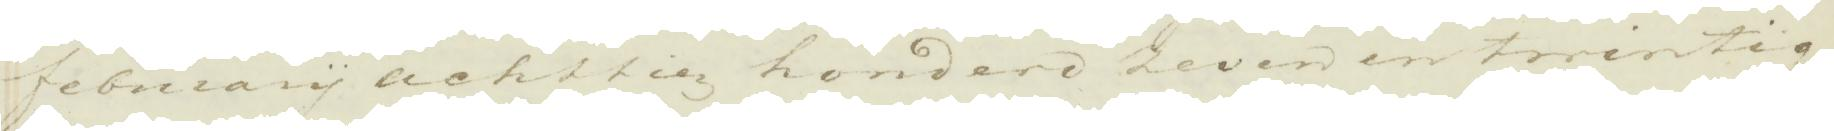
Februarij achttien honderd Zeven en twintig
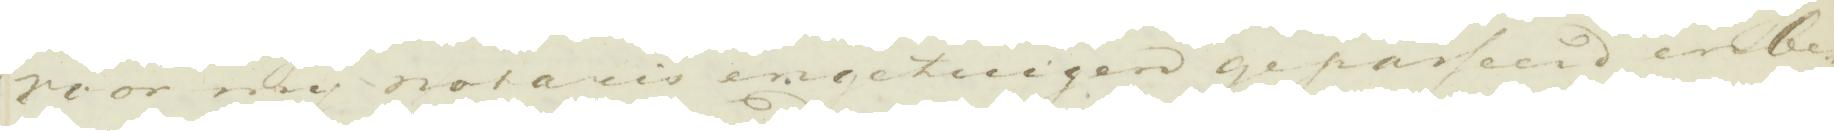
voor my notaris en getuigen gepasseerd en be
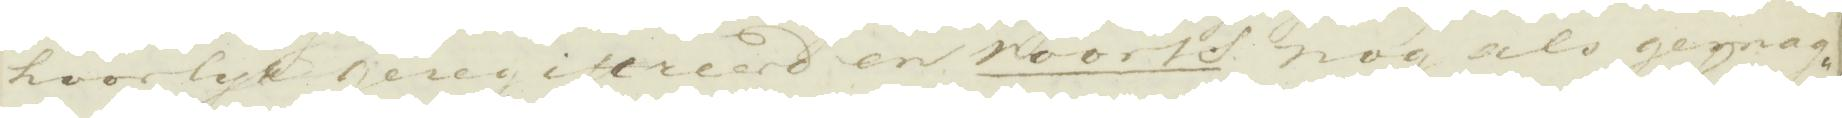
hoorlyk geregistreerd en voorts nog als gemag„
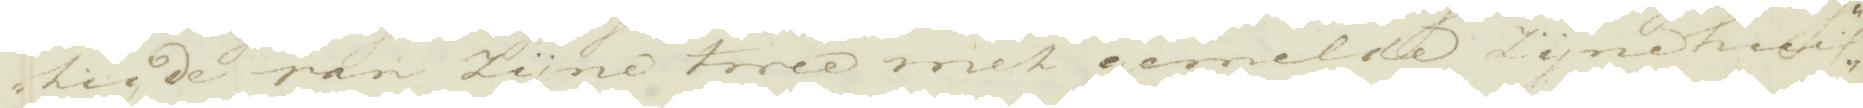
„tigde van zijne twee met gemelde zijne huis„
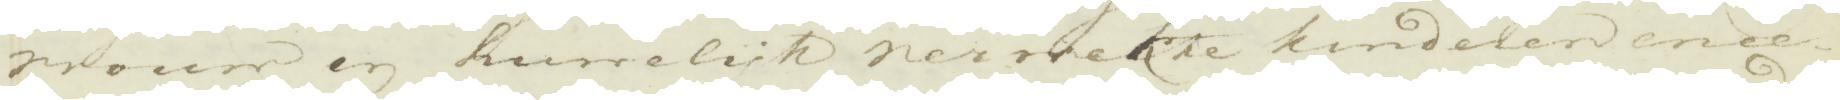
vrouw en huwelijk verwekte kinderen en een
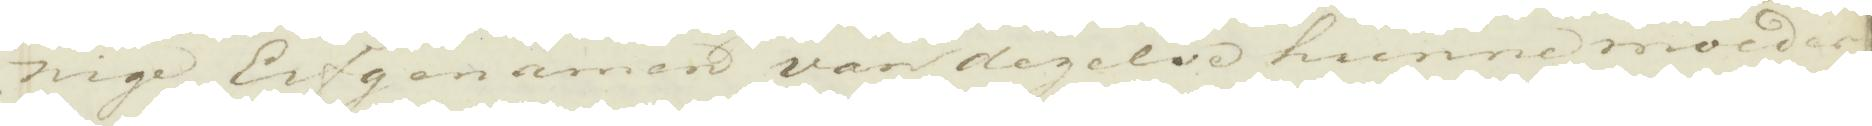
nige Erfgenamen van dezelve hunne moeder
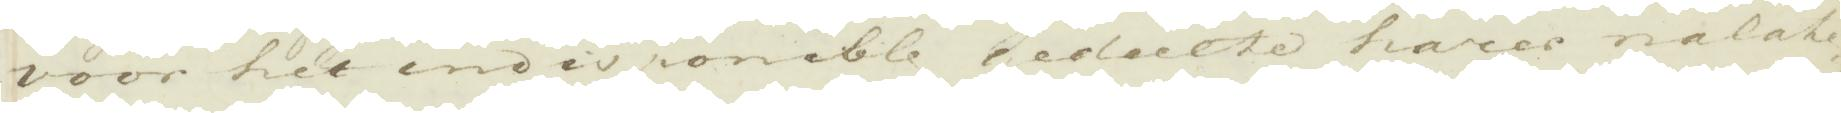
voor het indisponible gedeelte harer nalaten
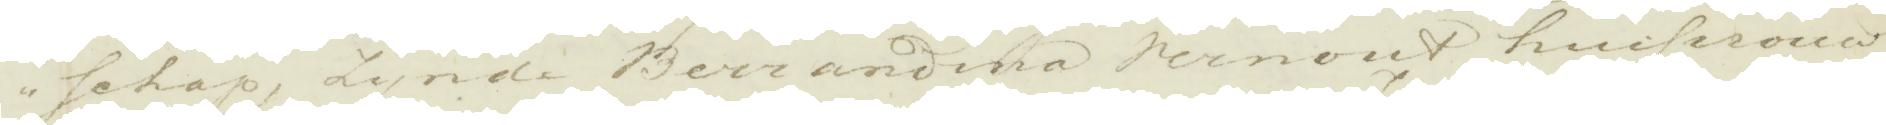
„schap, Zynde Berrandina Vernout huisvrouw
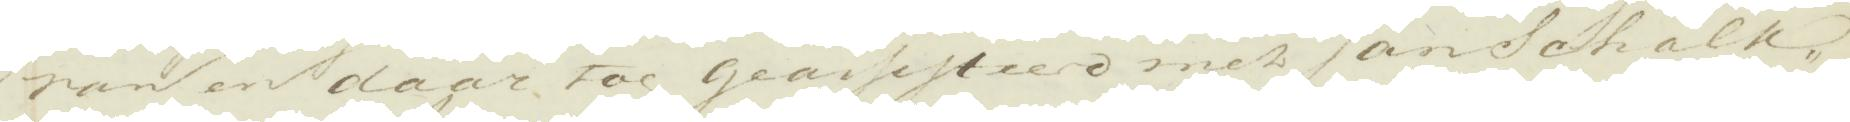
van en daar toe geassisteerd met Jan Schalk„
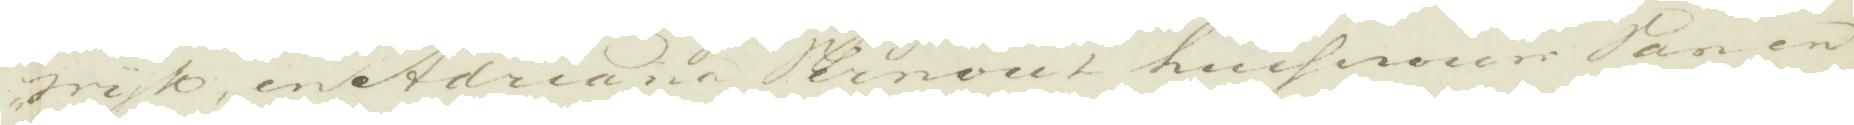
„wijk, en Adriana Vernout huisvrouw Van en
